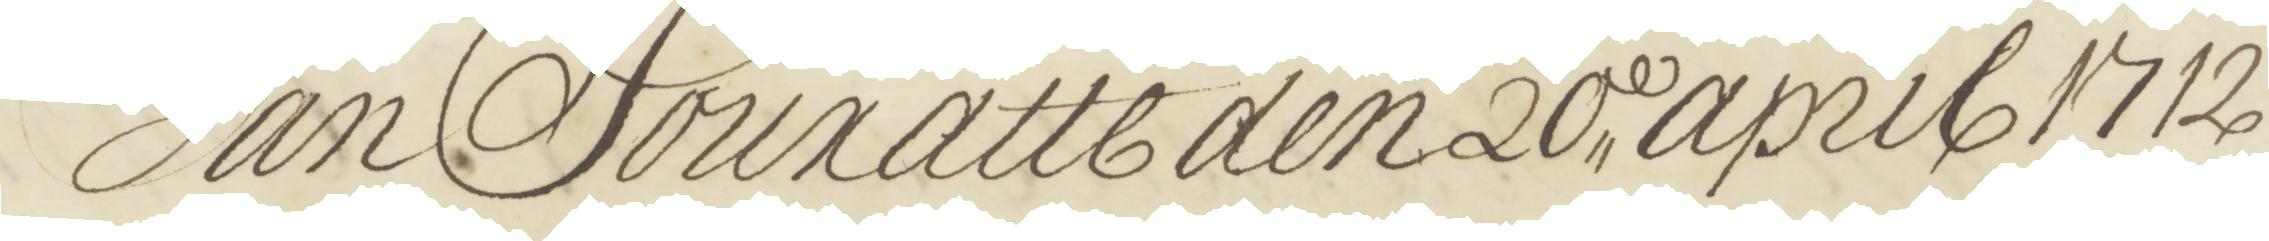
Van Souratte den 20„e april 1712
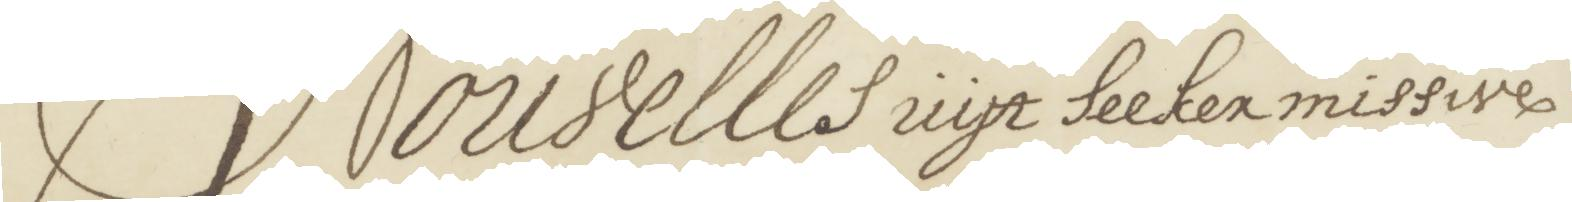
Nouvelles uijt seeker missive
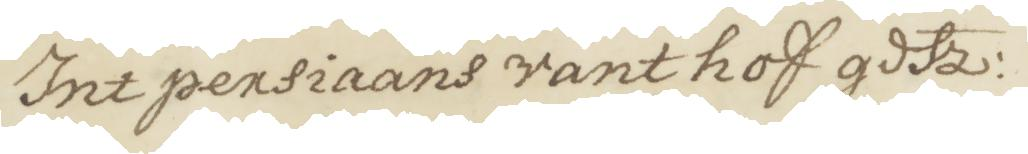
Int persiaans vant hof gesz:
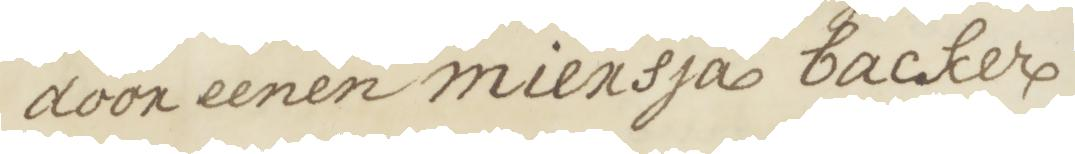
door eenen miersja backer
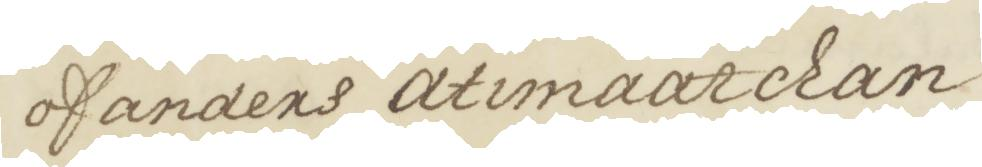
of anders atimaarchan
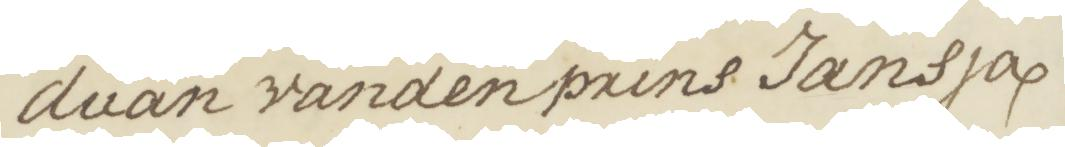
duan vanden prins Iansja
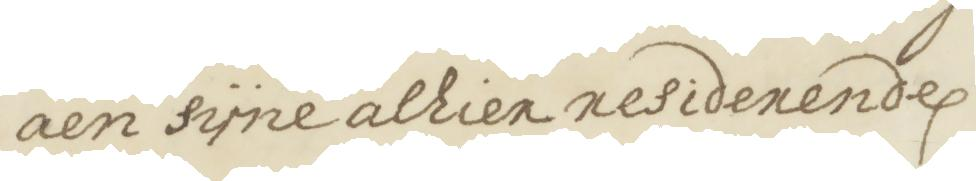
aen sijne alhier residerende
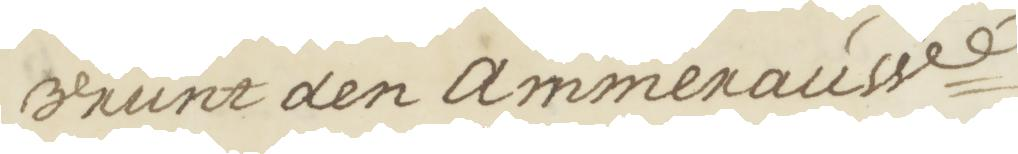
Vrunt den Ammerauw=e
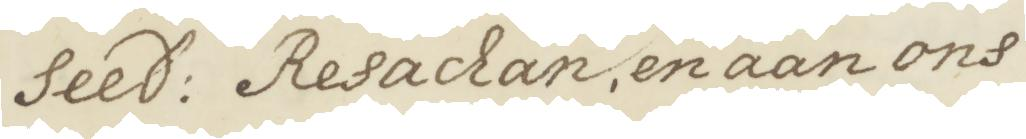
seed: Resachan, en aan ons
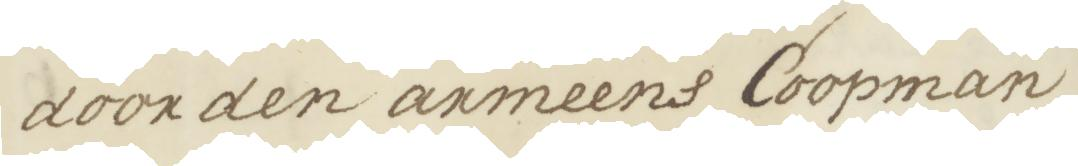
door den armeens Coopman
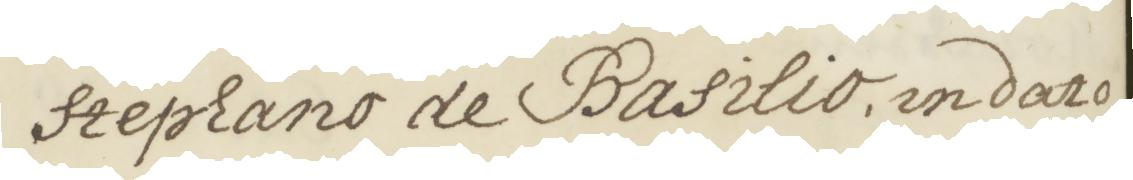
stephano de Basilio, in dato
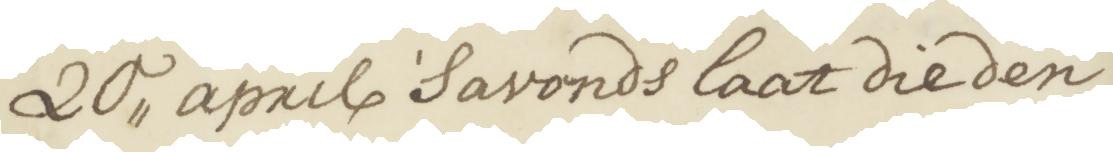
20„e april 'savonds laat die den
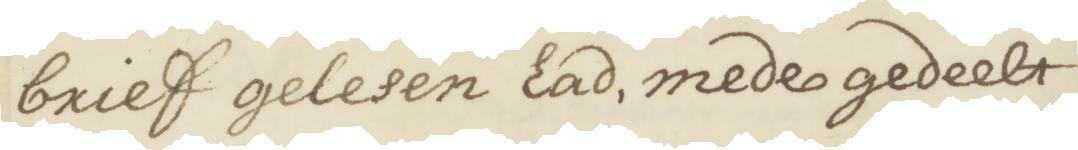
brief gelesen had, mede gedeelt
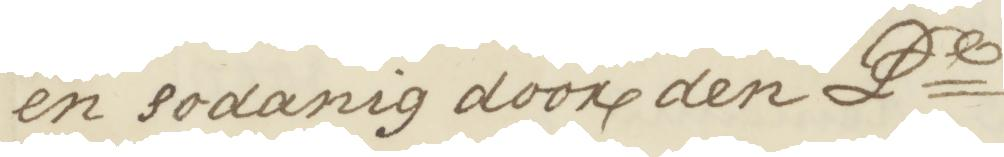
en sodanig door den P=e
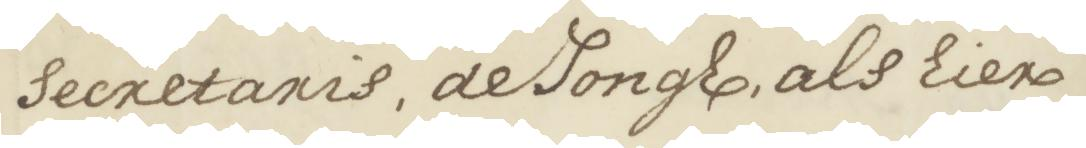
secretaris, de Iongh, als hier
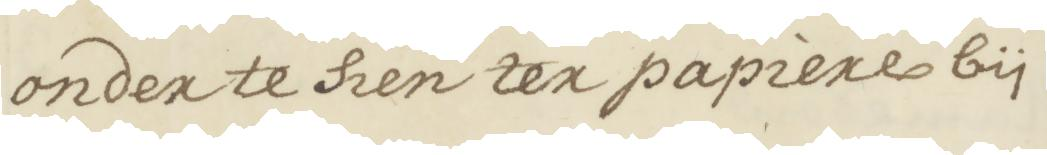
onder te sien ter papiere bij
